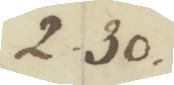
2. 30.
